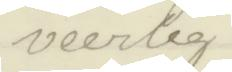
veerteg
